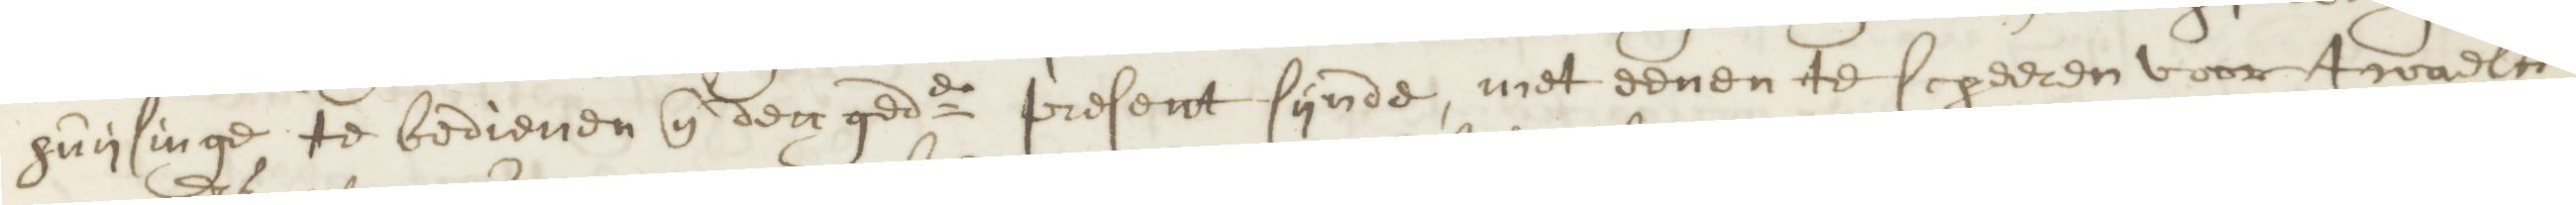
huijsinge te bedienen ende den ged=e present sijnde, met eenen te scheeren voor twaelft
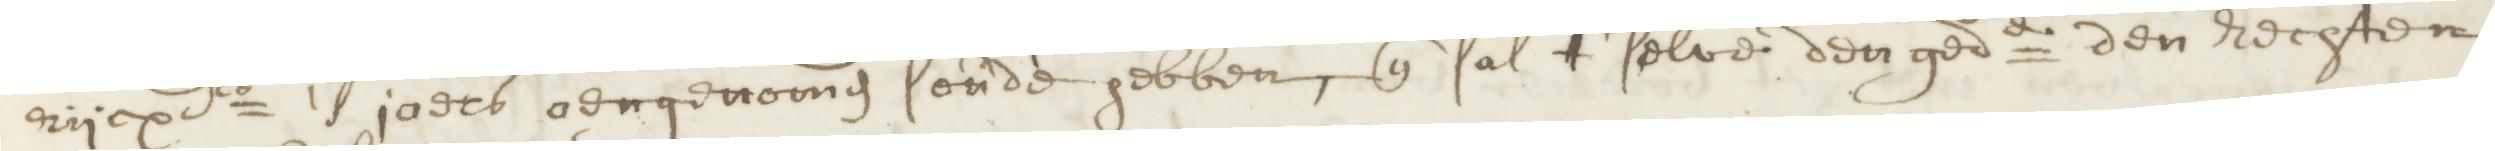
rijcxd=rs 's jaers aengenomen soude hebben, ende sal t' selve den ged=e den rechten
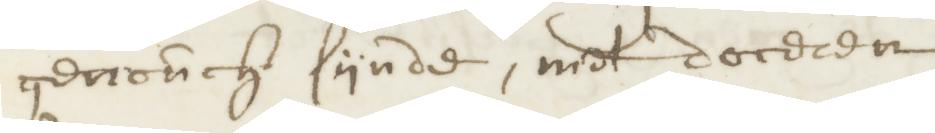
genouch sijnde, met doceren
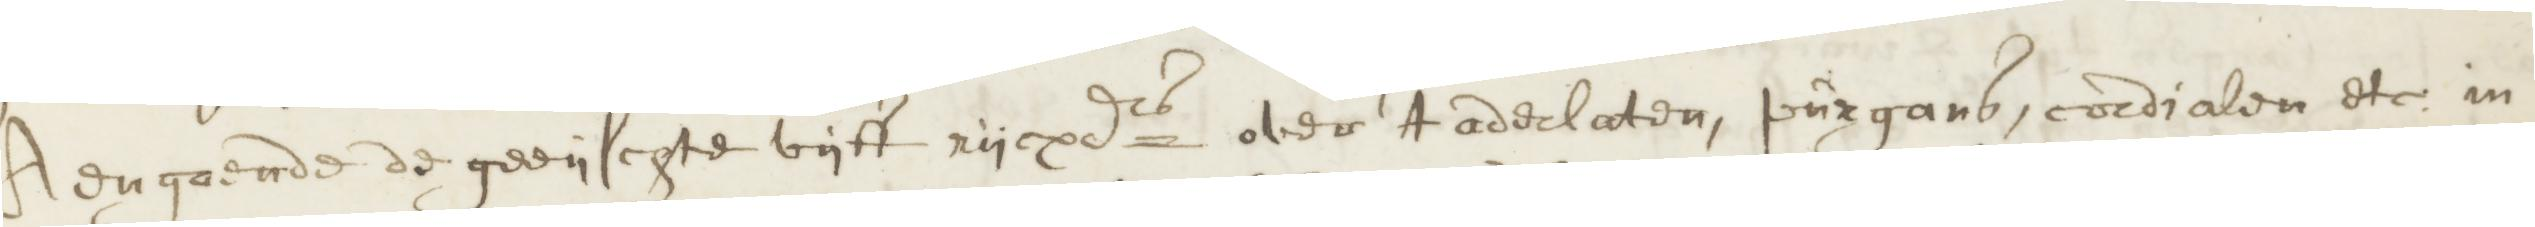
Aengaende de geeijschte vijff rijcxd=rs over 't aderlaten, purgans, cordialen etc: in
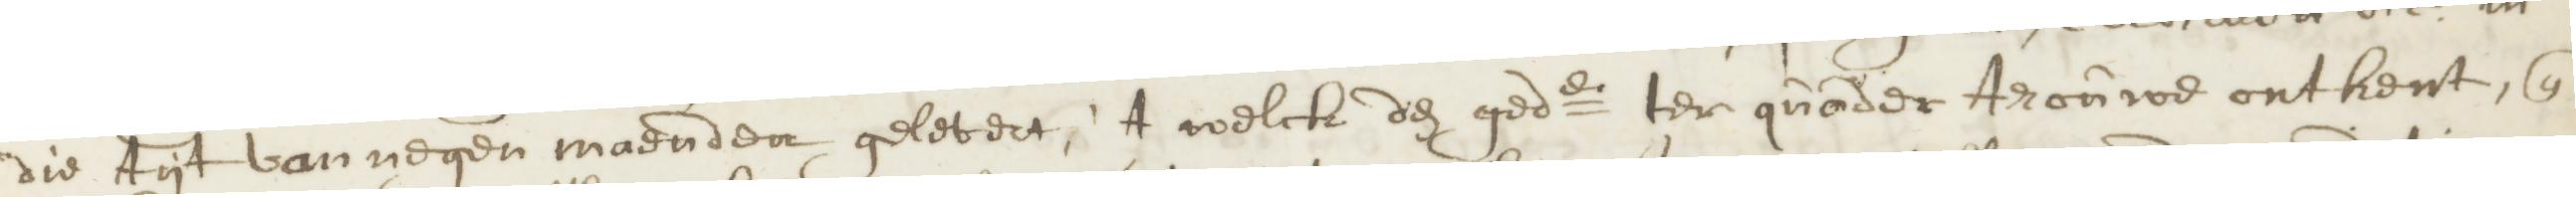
die tijt van negen maenden gelevert, ’t welck den ged=e ter quader trouwe ontkent, ende
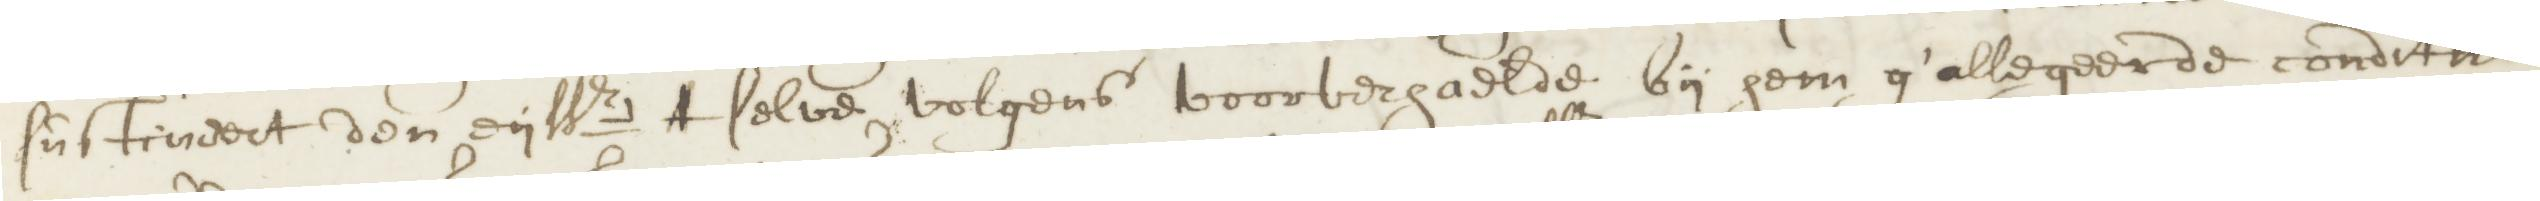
sustineert den eijss=r 't selve volgens voorverhaelde bij hem g’allegeerde conditie
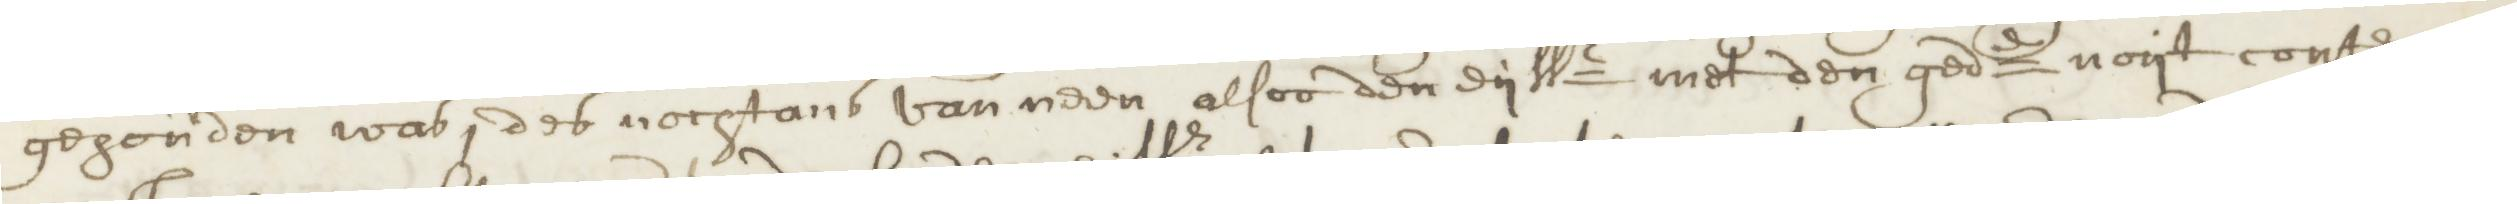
gehouden was, des nochtans van neen alsoo den eijss=r met den ged=e noijt contract
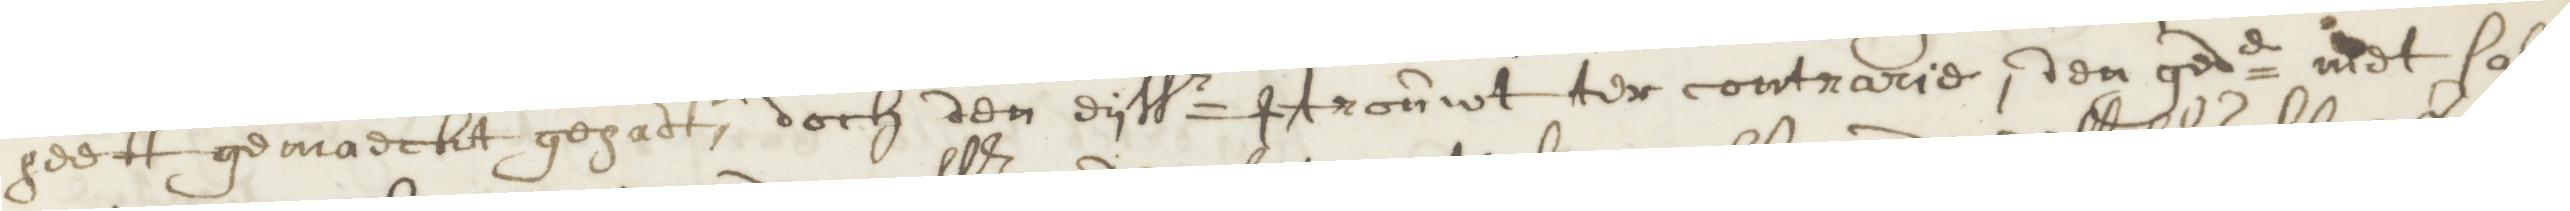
heeft gemaeckt gehadt, doch den eijss=r vertrouwt ter contrarie, den ged=e niet sal
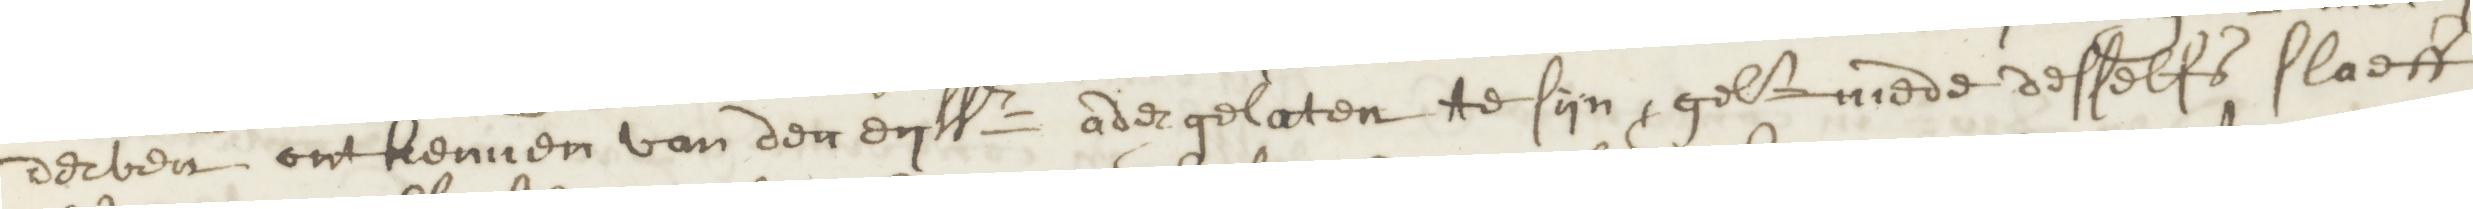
derven ontkennen van den eyss=r adergelaten te sijn, gelijk mede desselfs slaeff
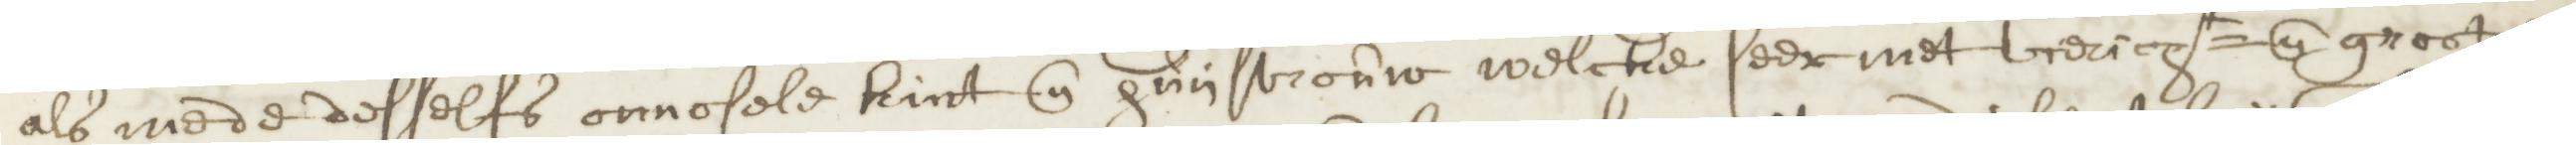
als mede desselfs onnosele kint ende huijsvrouw welcke seer met verich=t ende groote
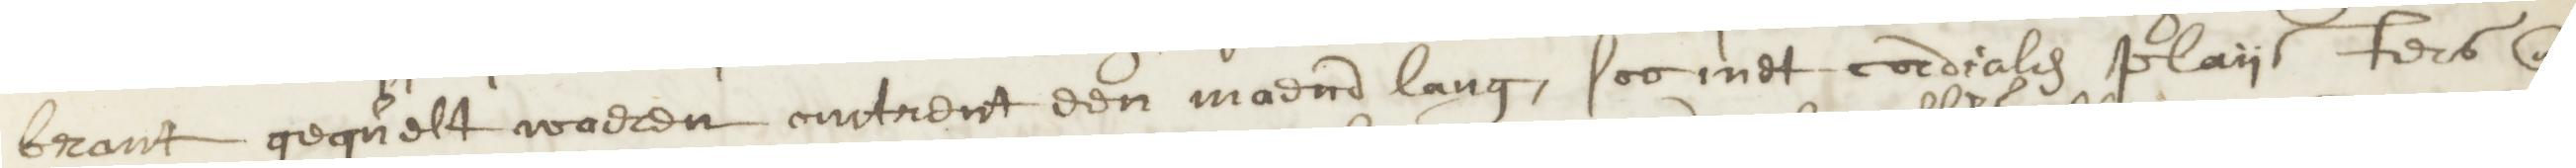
brant gequelt waeren omtrent een maend lang, soo met cordialen plaijsters ende
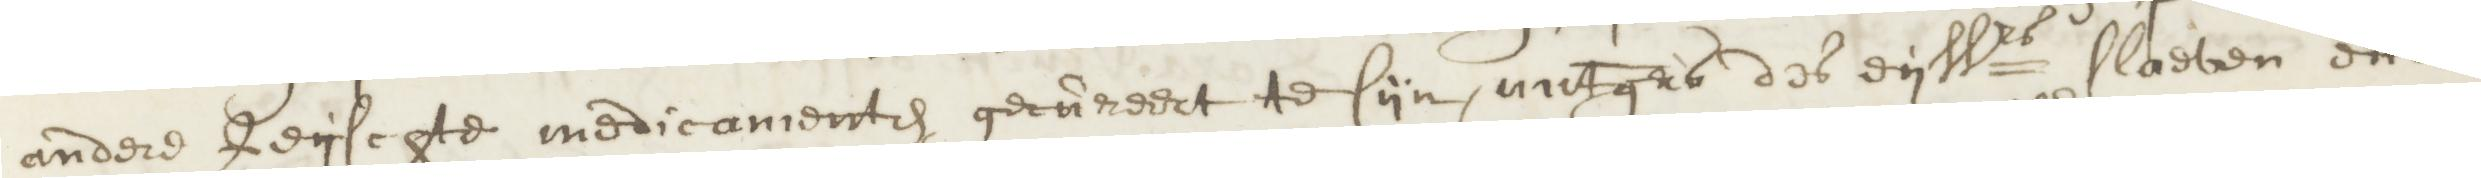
andere vereijschte medicamenten gecureert te sijn, mitgrs des eijss=rs slaeven ende
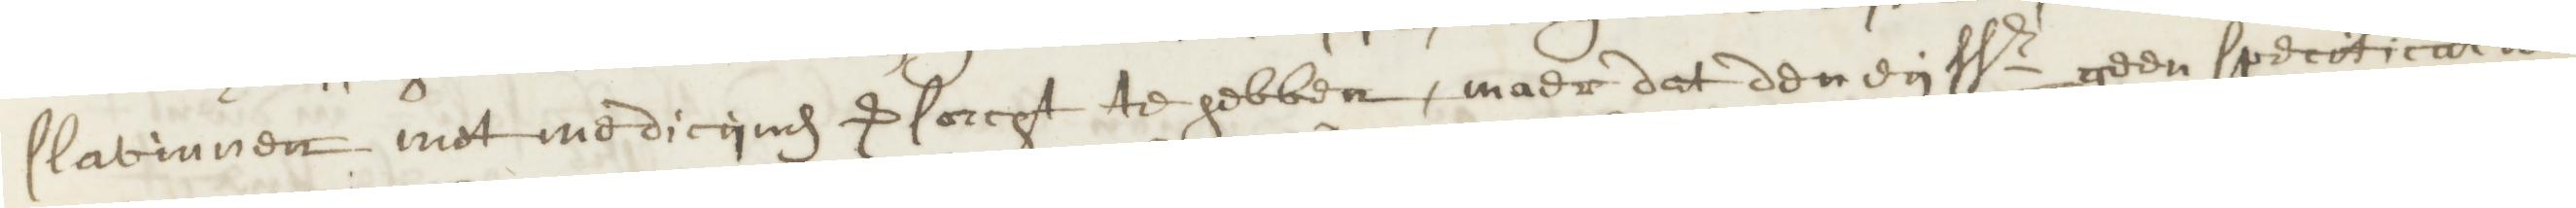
slavinnen met medicijnen versorcht te hebben, maer dat den eijss=r geen specificatie
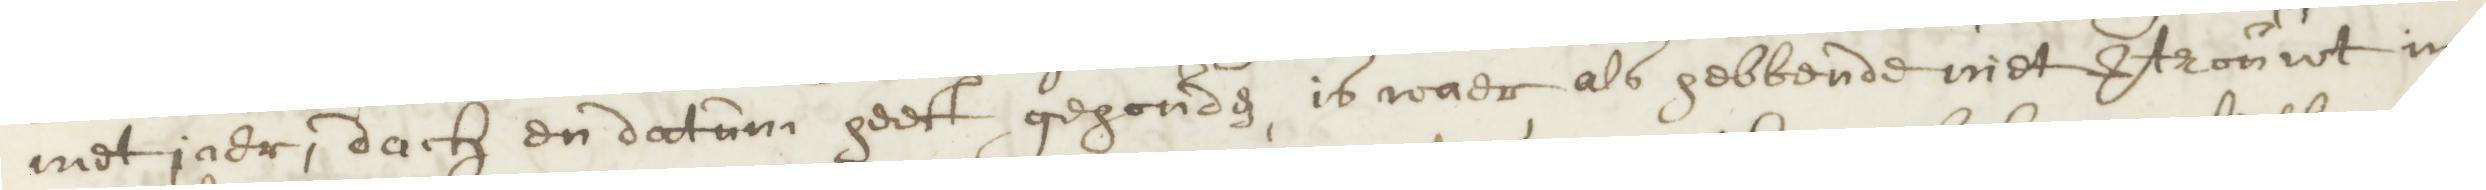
met jaer, dach en datum heeft gehouden, is waer als hebbende niet vertrouwt in
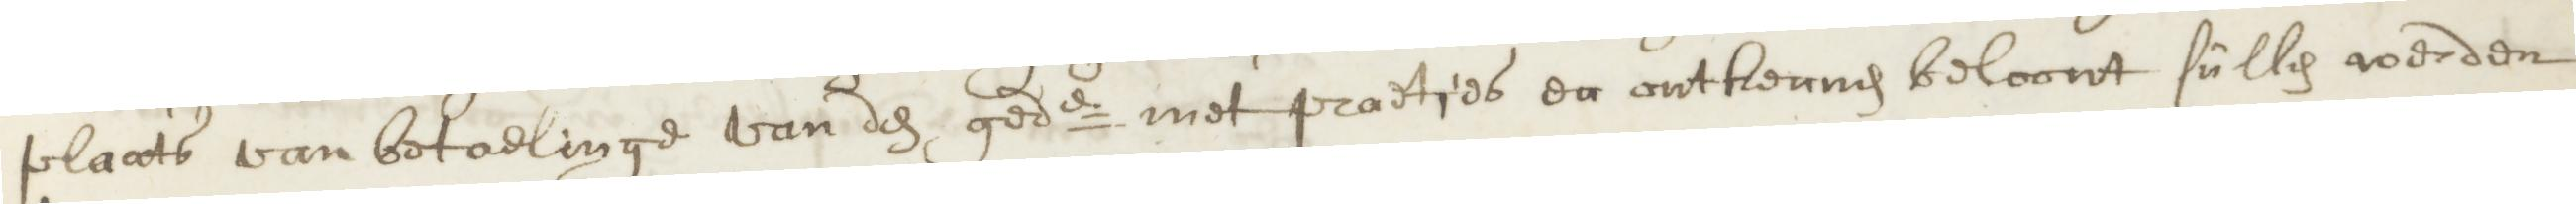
plaats van betaelinge van den ged=e met praetjes en ontkennen beloont sullen werden
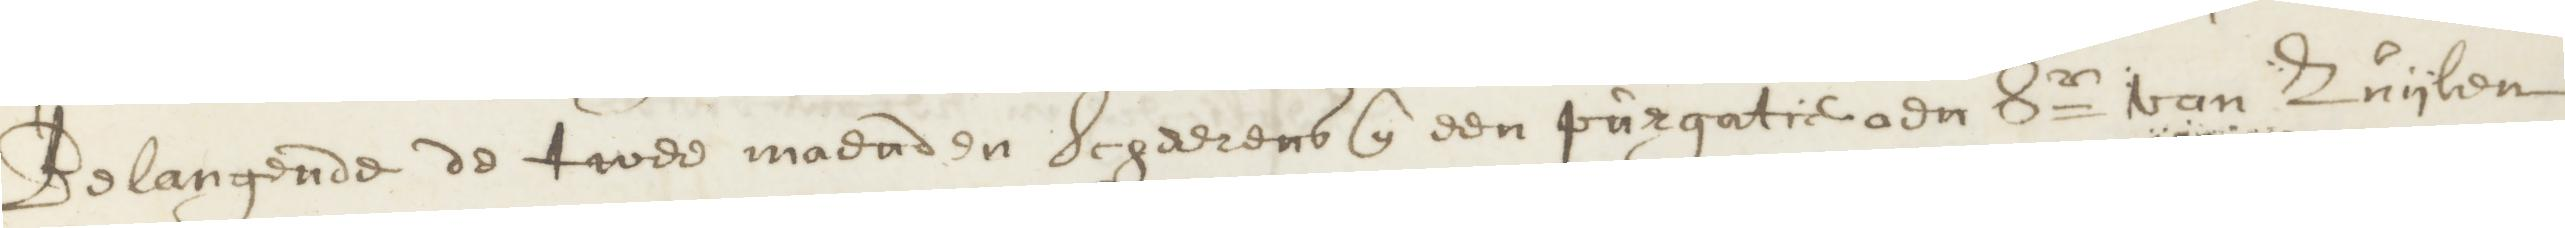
Belangende de twee maenden schaerens ende een purgatie aen H=r van Zuijlen
